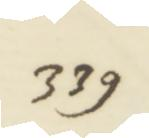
339
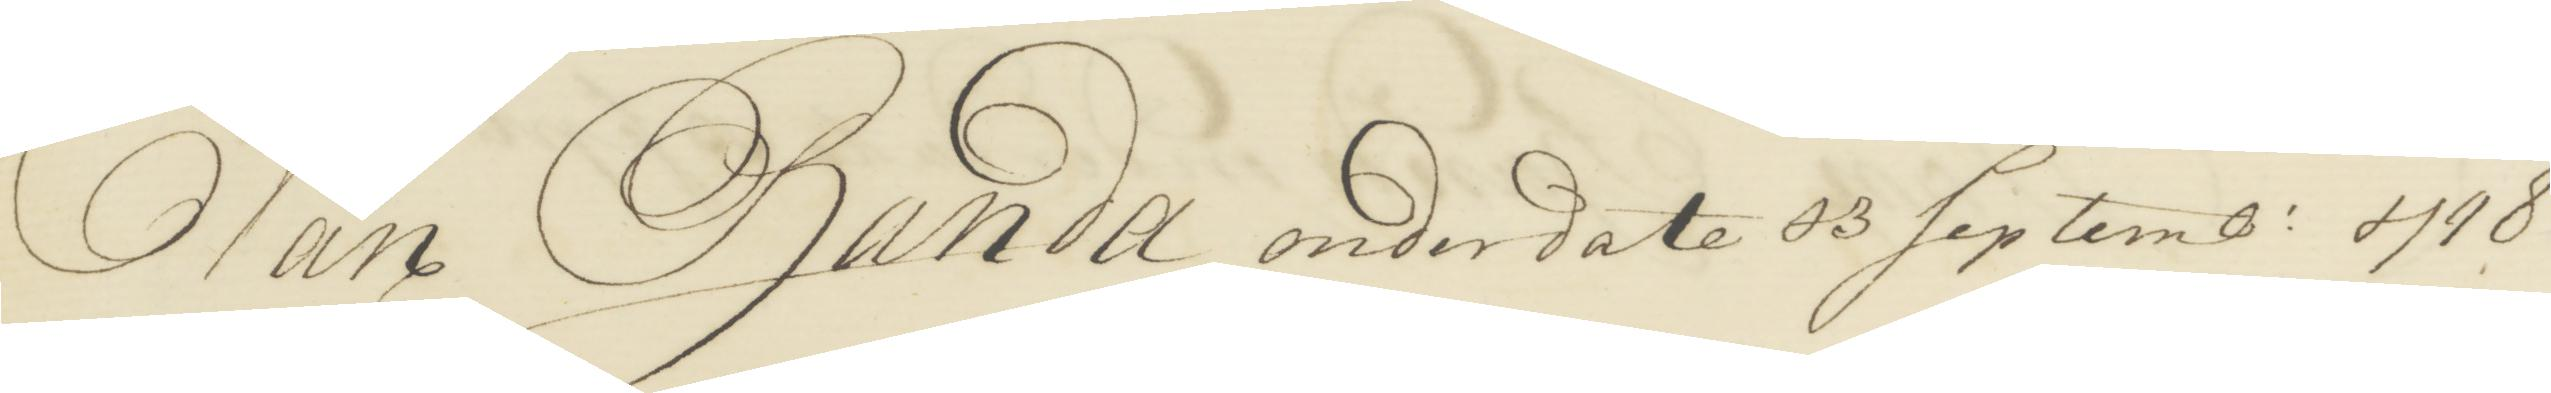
Van Banda onder dato 23 septemb: 1748
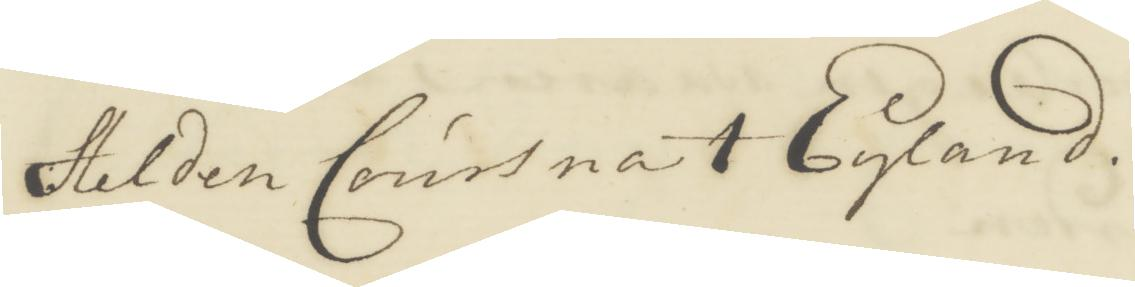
stelden Cours na t Eijland.
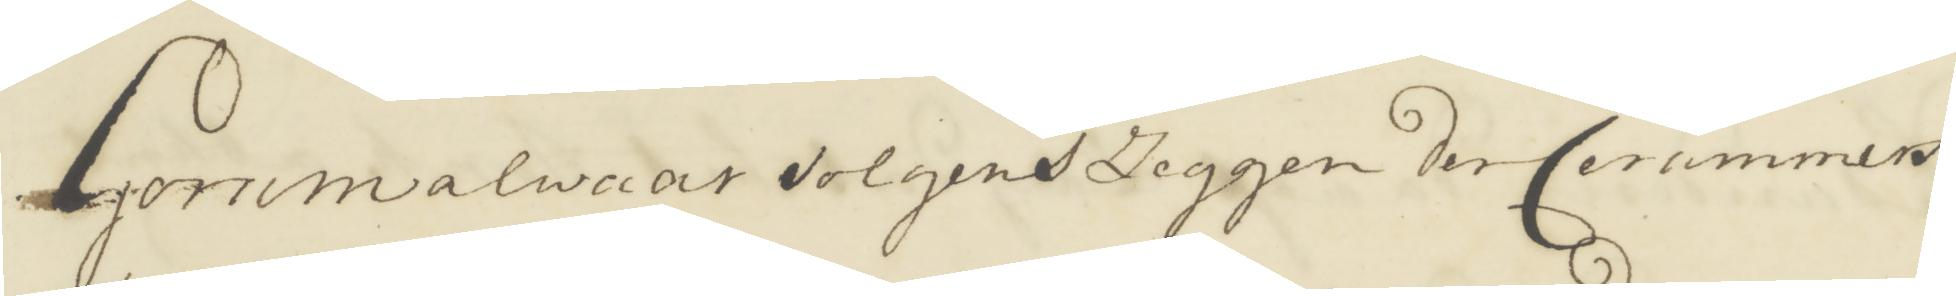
Gorum alwaar volgens zeggen der Cerammers
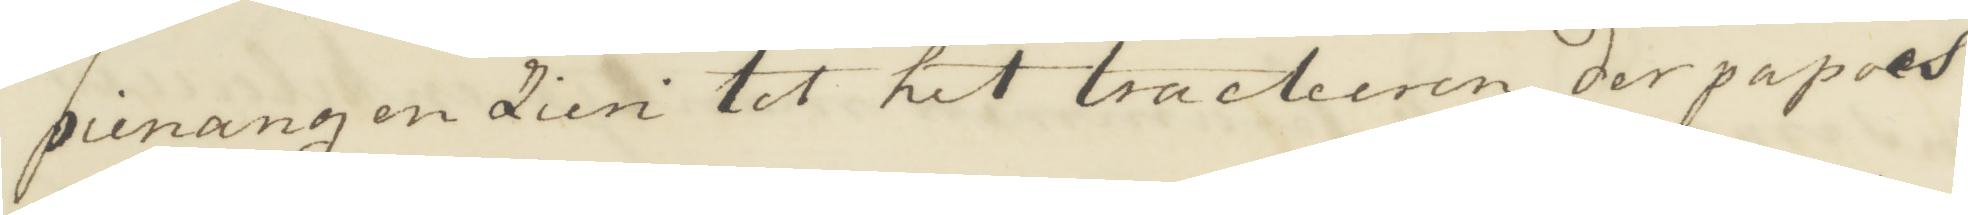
pienang en zieri tot het tracteeren der papoes
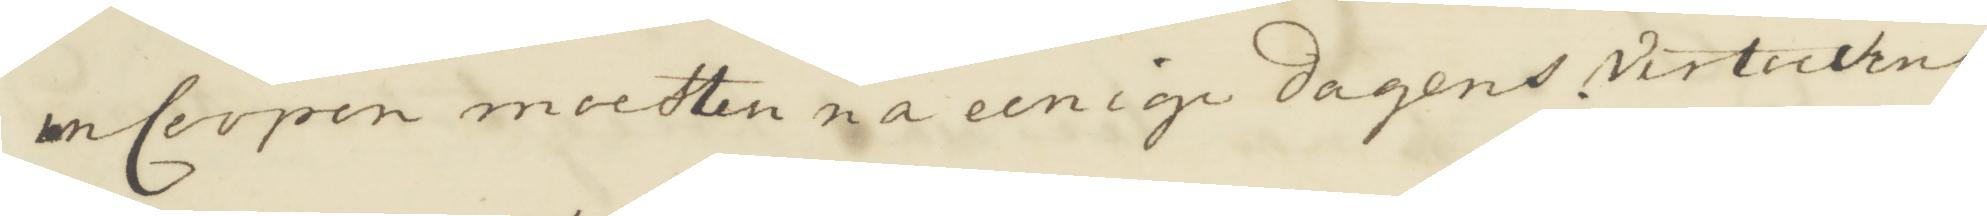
in cooper moesten na eenige dagens vertoevens
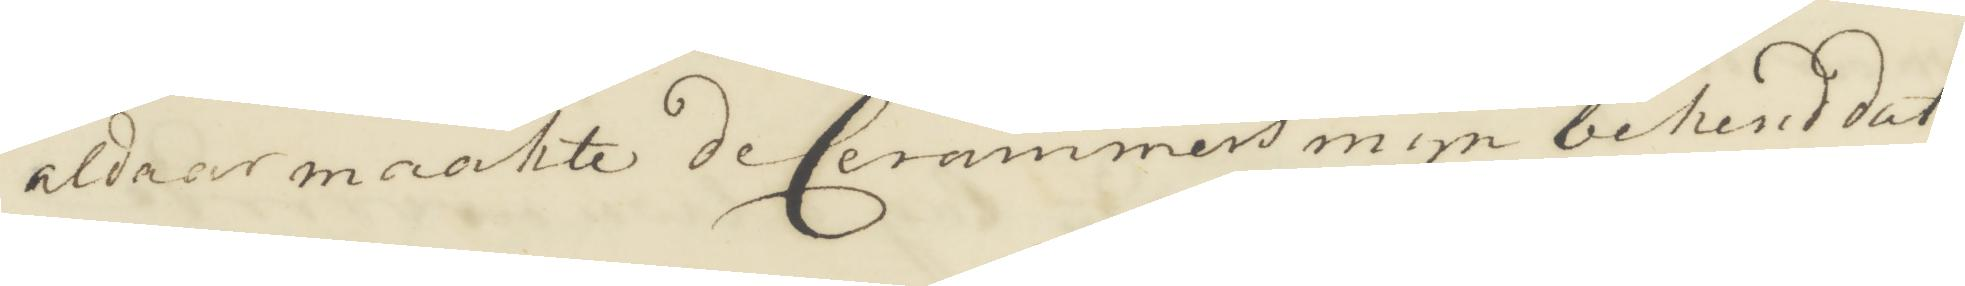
aldaar maakte de Cerammers mijn bekend dat
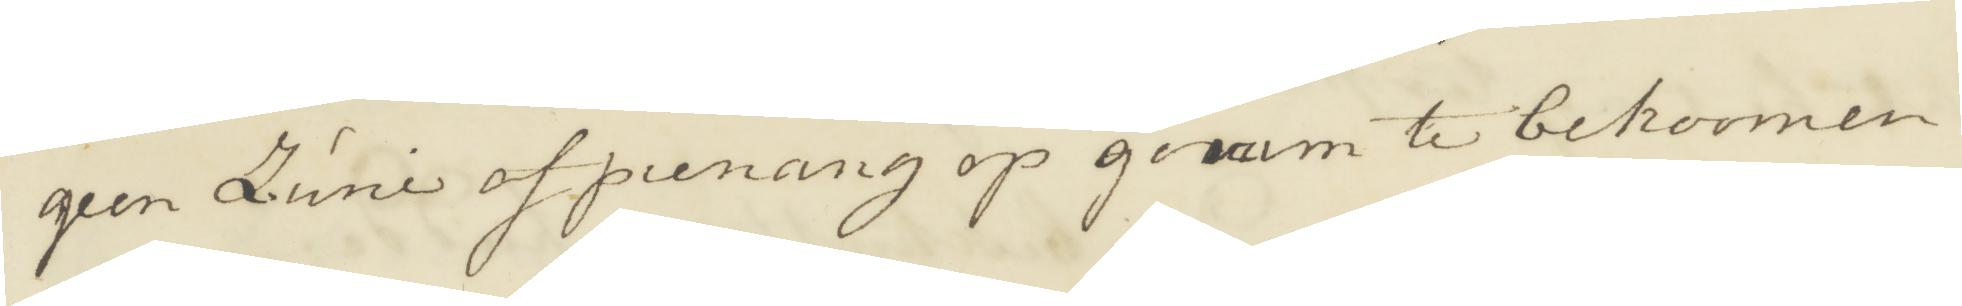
geen zurie of pienang op gorum te bekoomen
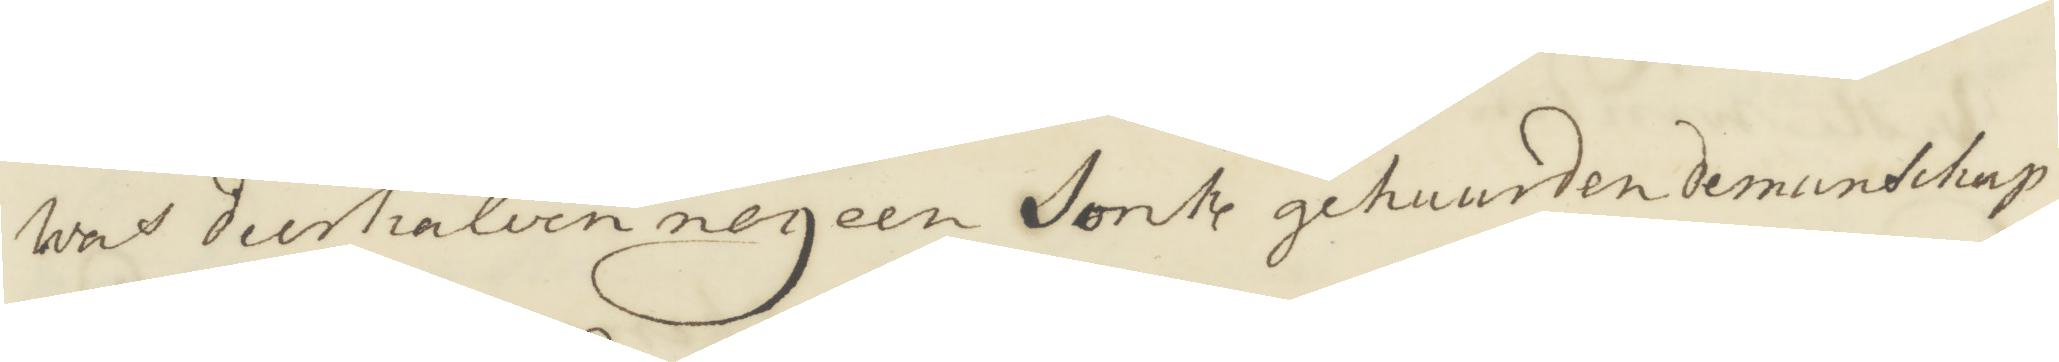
was dierhalven nog een Ionk gehuurd en demanschap
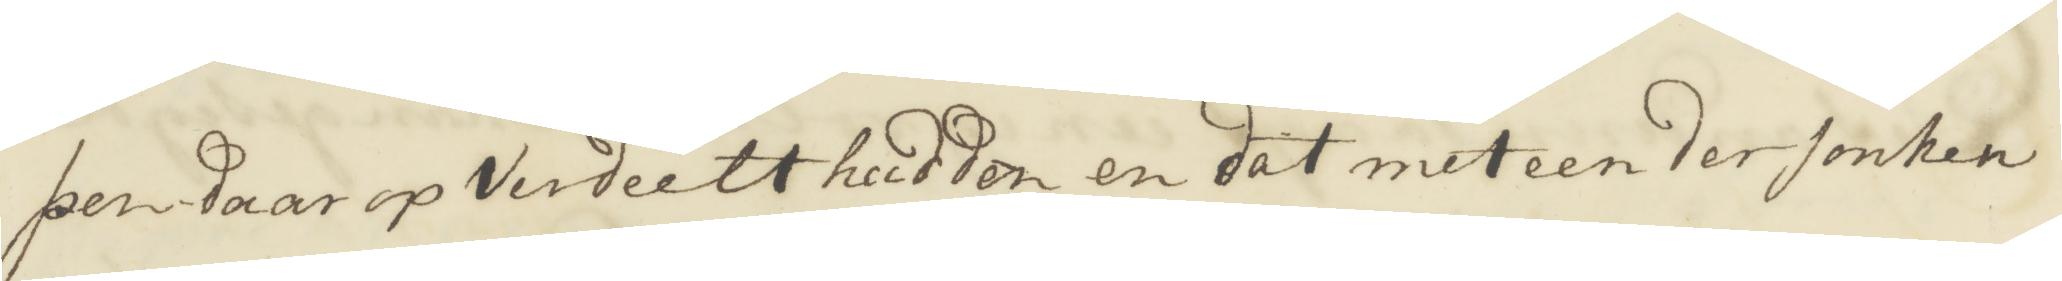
pen daar op verdeelt hadden en dat met een der Jonken
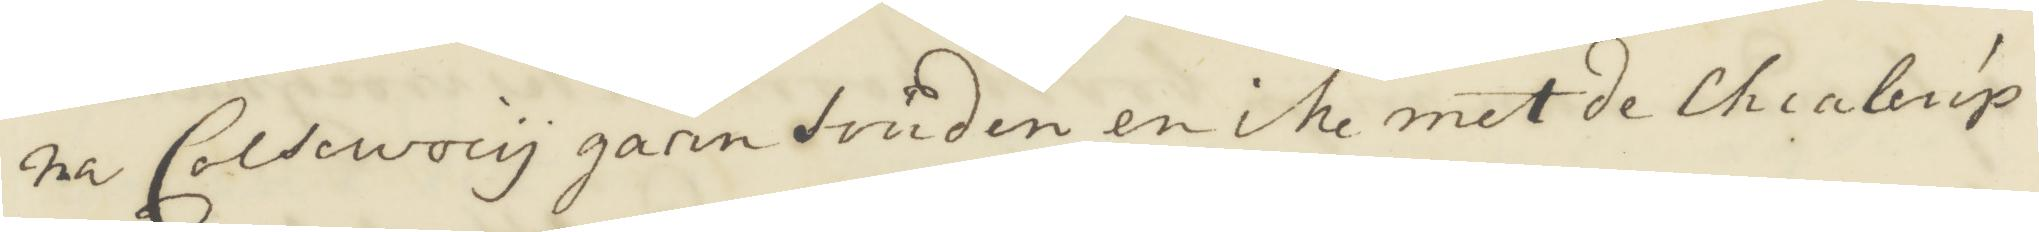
na Colseworij gaan souden en ik met de chialeup
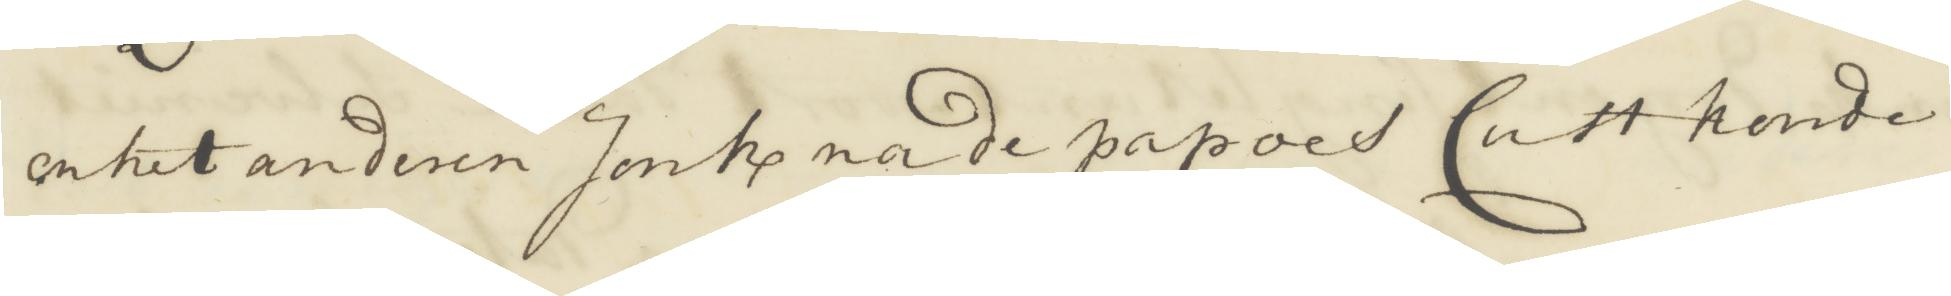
enhet anderen Jonk na de papoes cust konde
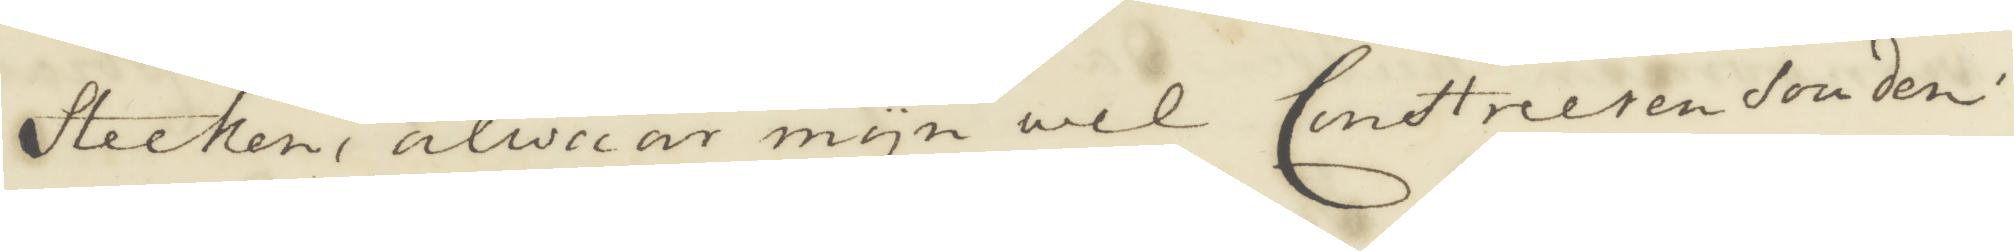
steeken, alwaar mijn wel constreeren souden
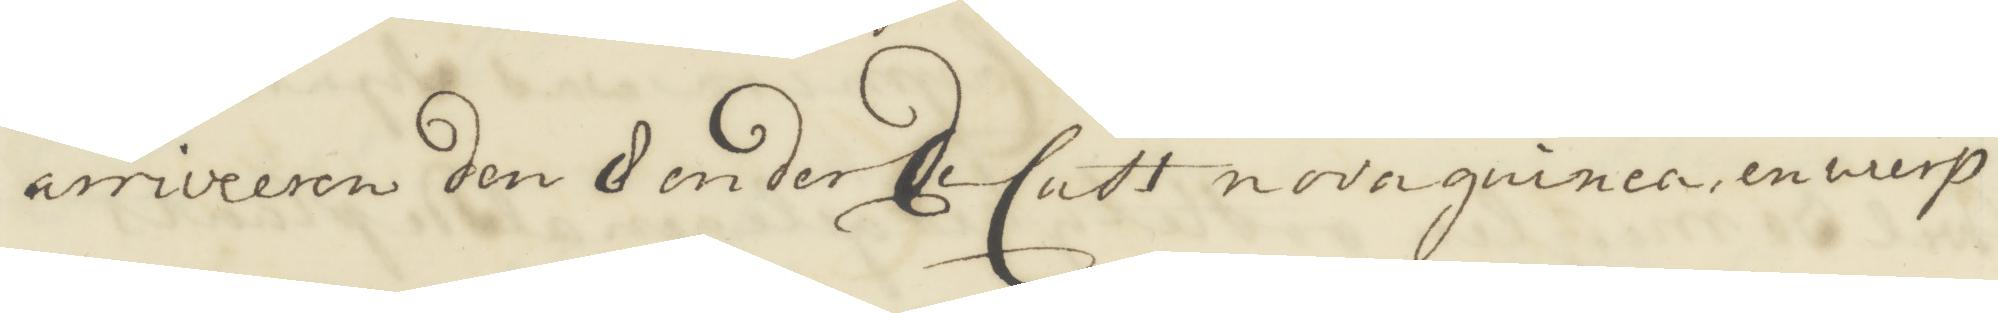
arriveeren den 8 onder de cust nova guinea, en wierp
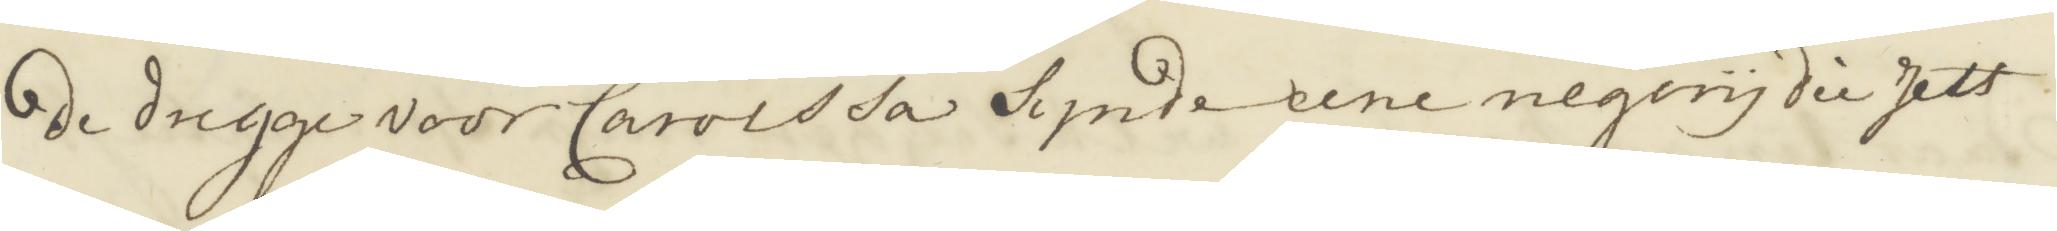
de dregge voor caroissa synde eene negorij die jets
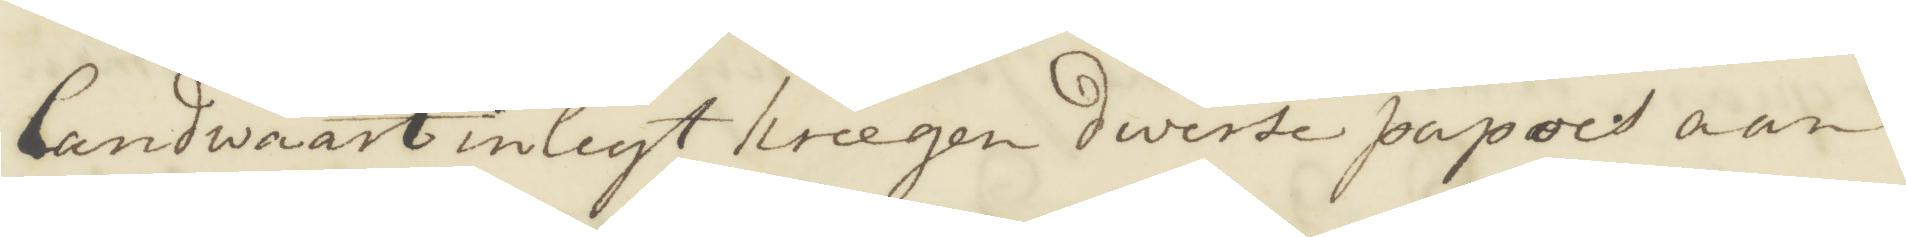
landwaart inlegt kreegen diverse papoes aan
